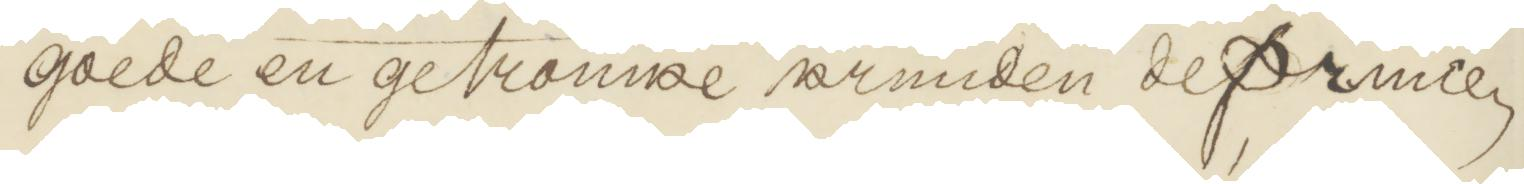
goede en getrouwe vrunden de princen
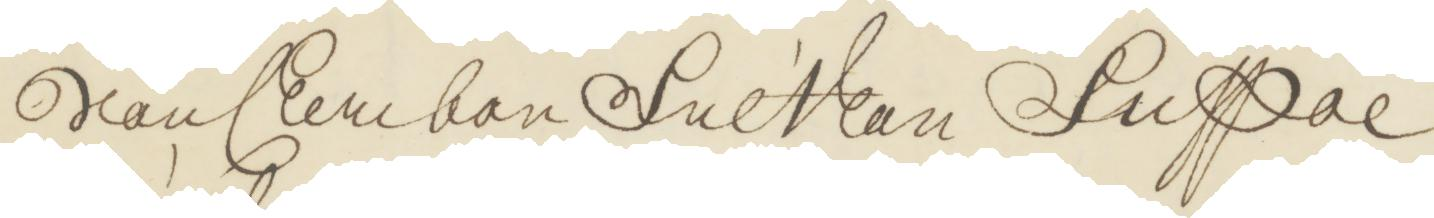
van Cheribon Sulthan Suppoe
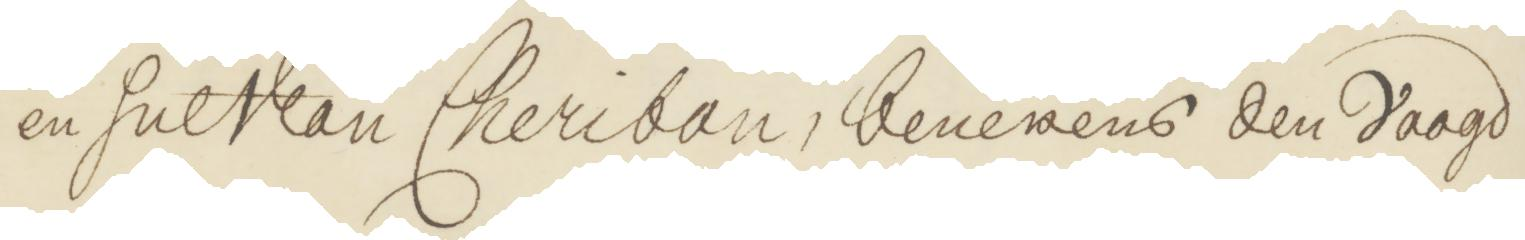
en sulthan Cheribon, benevens den voogd
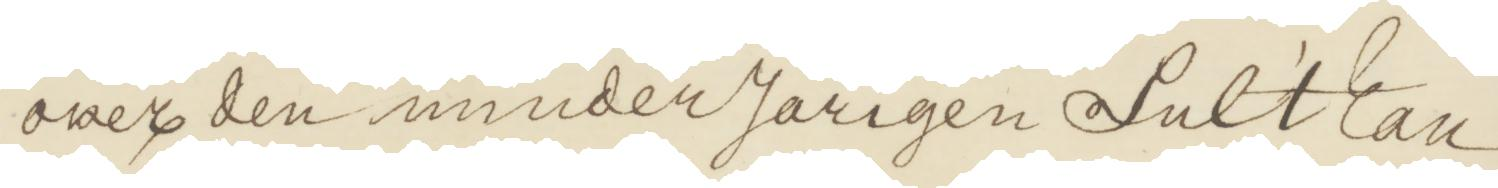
over den minderjarigen sul 'than
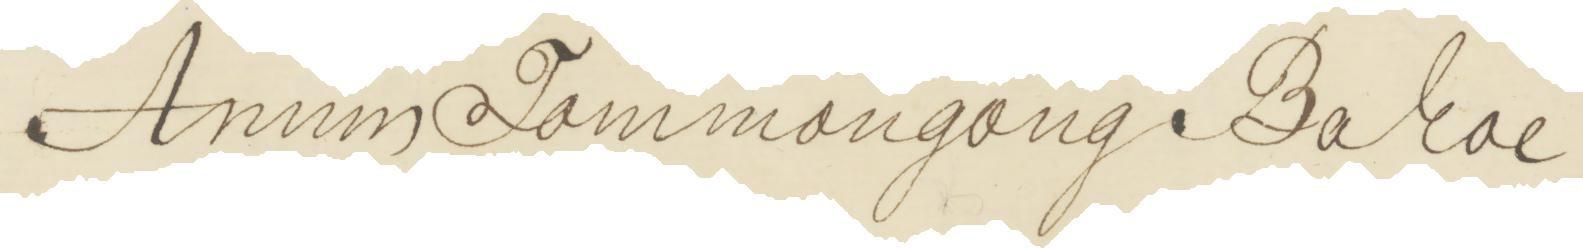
Anum Tommongong Bahoe
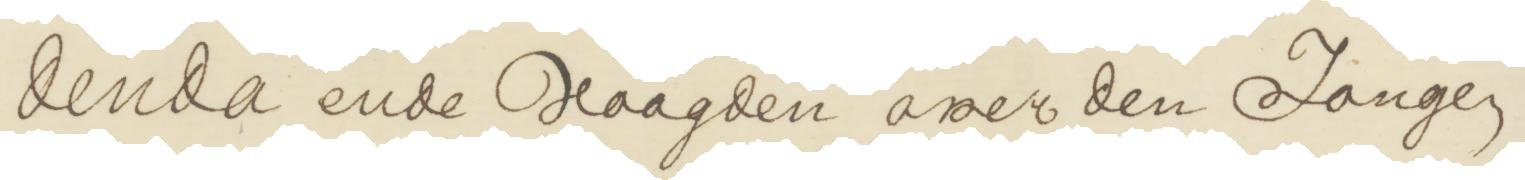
denda ende voogden over den Jongen
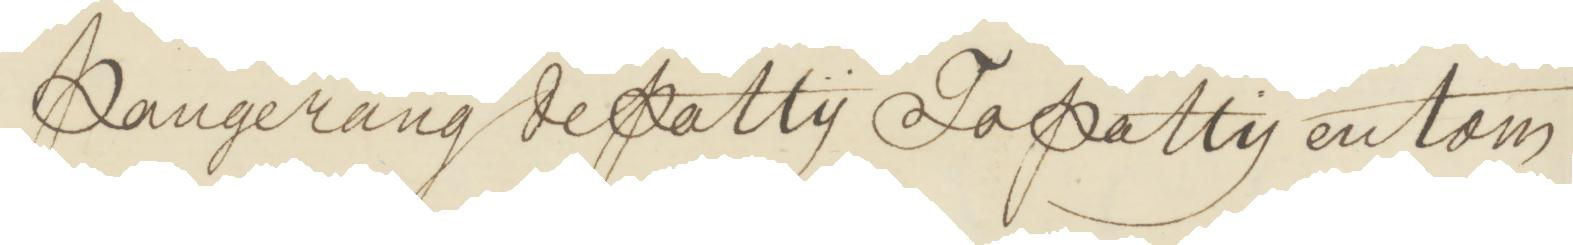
Pangerang depattij Topattij en tom
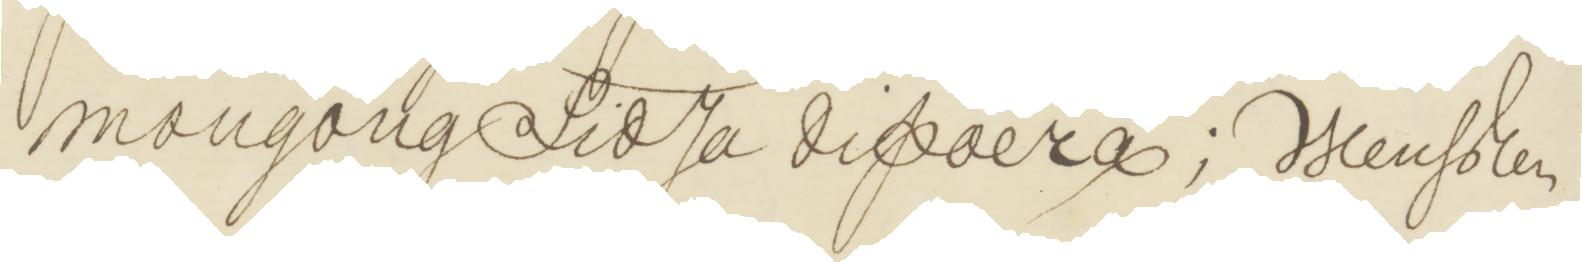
mongong Sidja dipoera: Wenschen
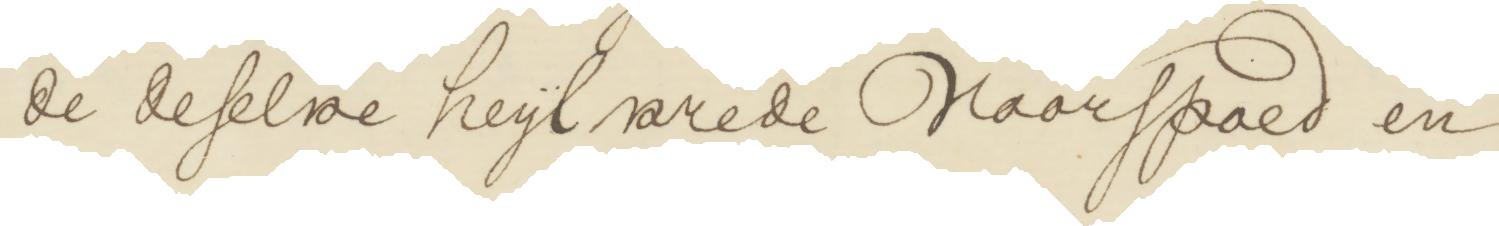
de deselve heijl vrede voorspoed en
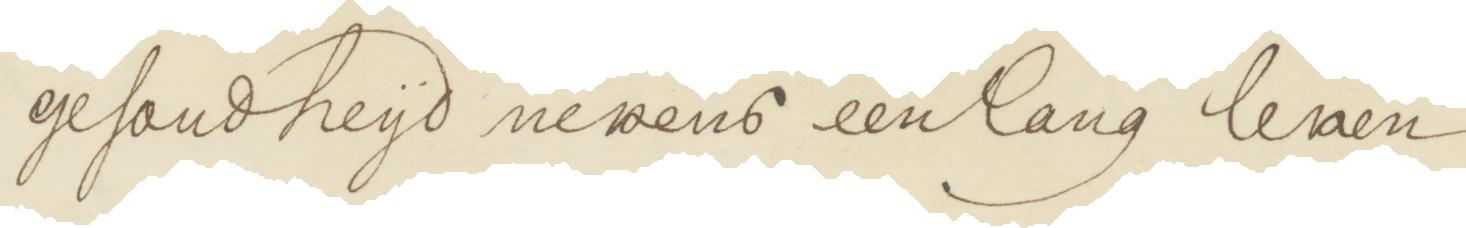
gesondheijd nevens een lang leven
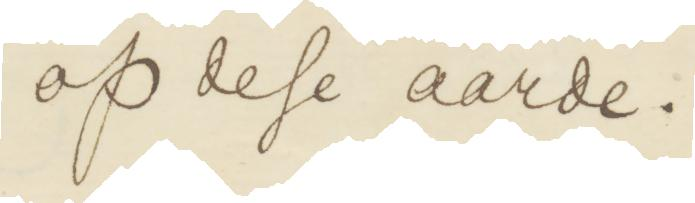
op dese aarde.
